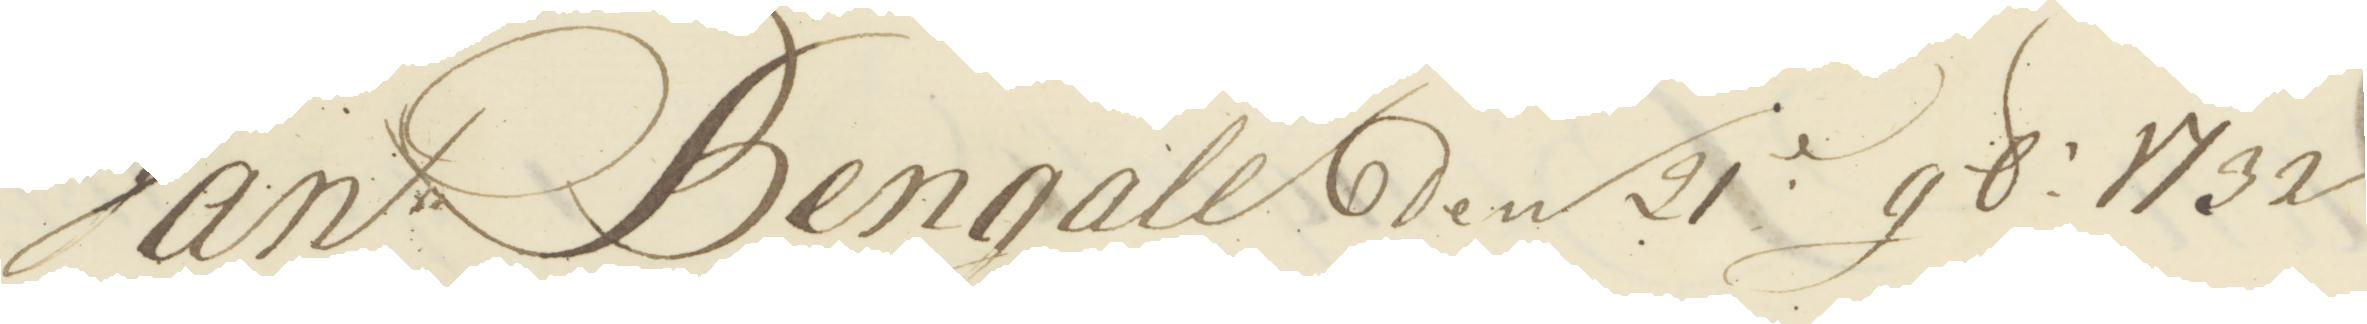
Van Bengale den 21:e 9b: 1732
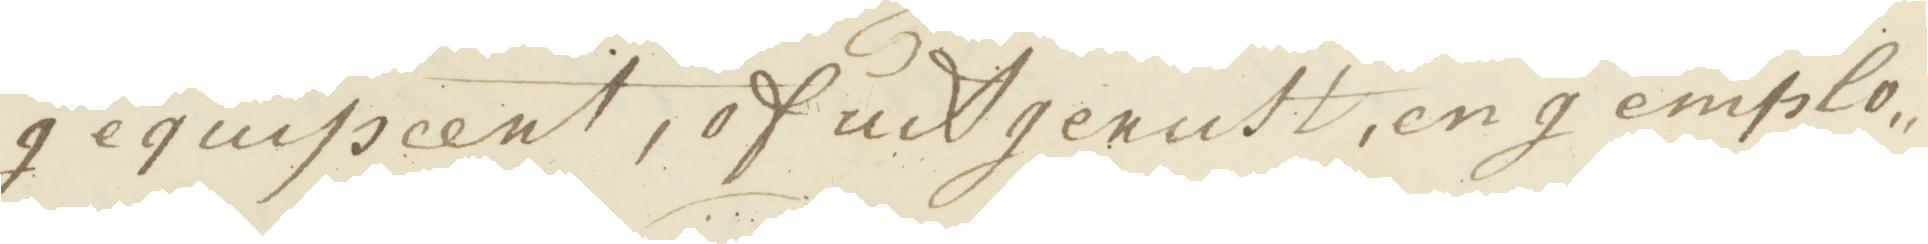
g' equipeert, of uitgerust, en g'emplo„
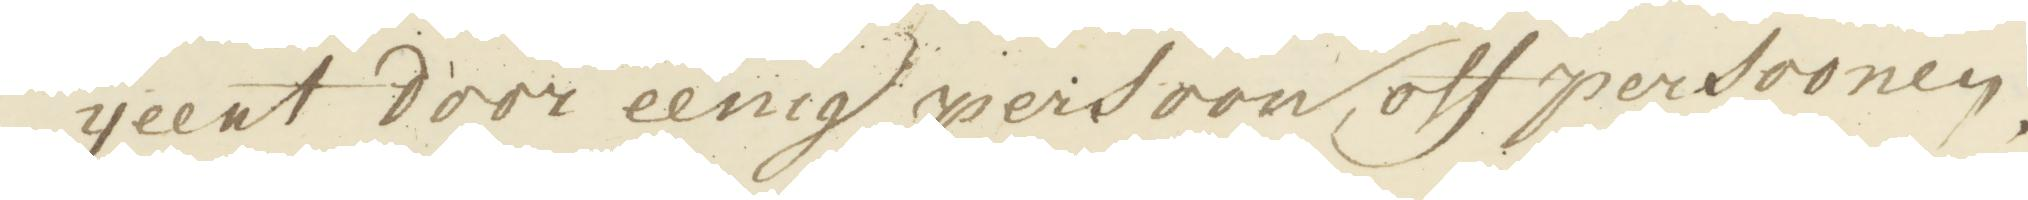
ijeert door eenig persoon, off persoonen,
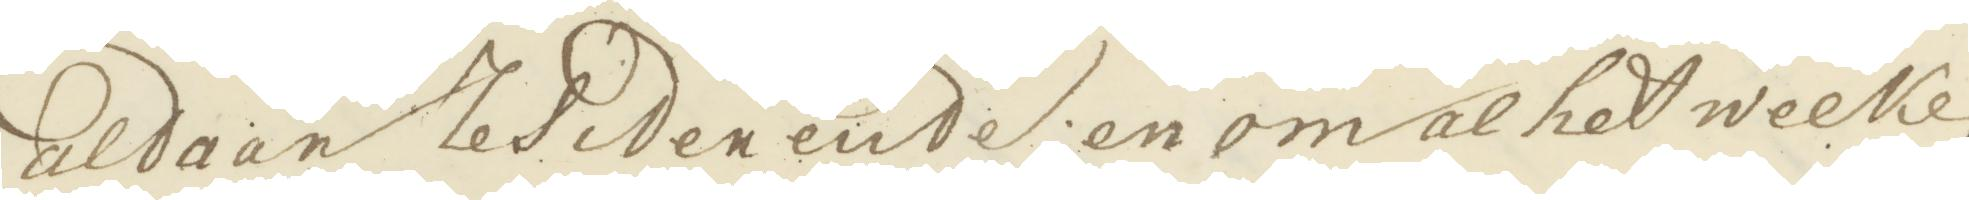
aldaan Residerende, en om al het welke
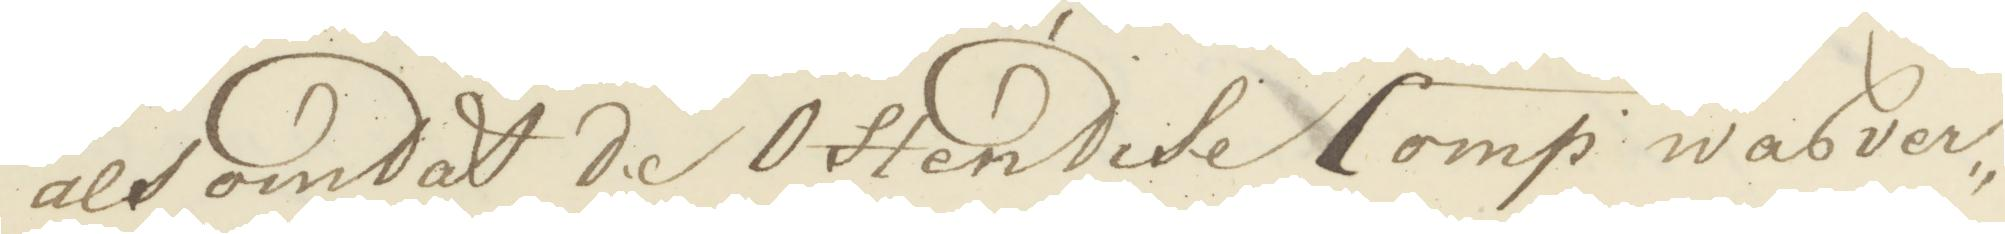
als omdat de Ostendise Comp: was ver„
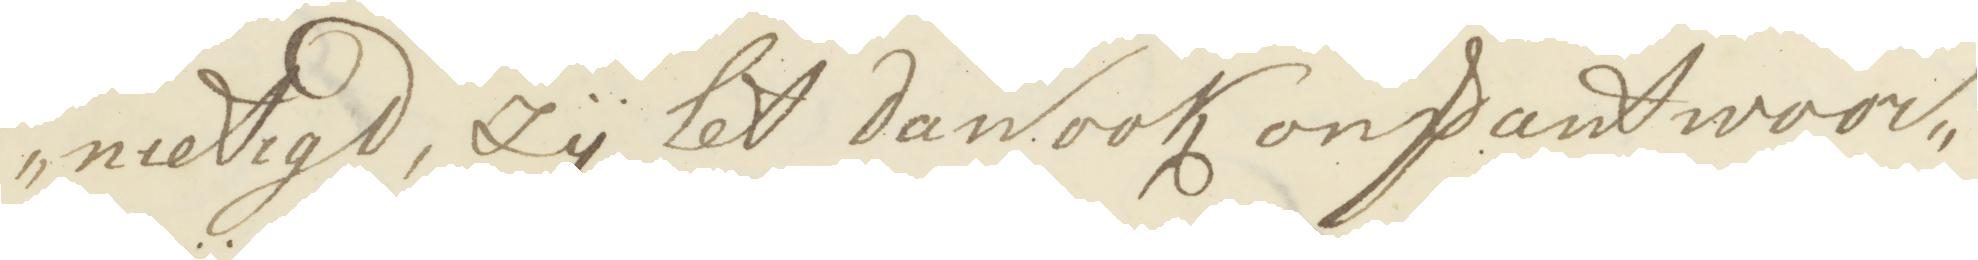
„nietigd, zij het dan ook onverantwoor„
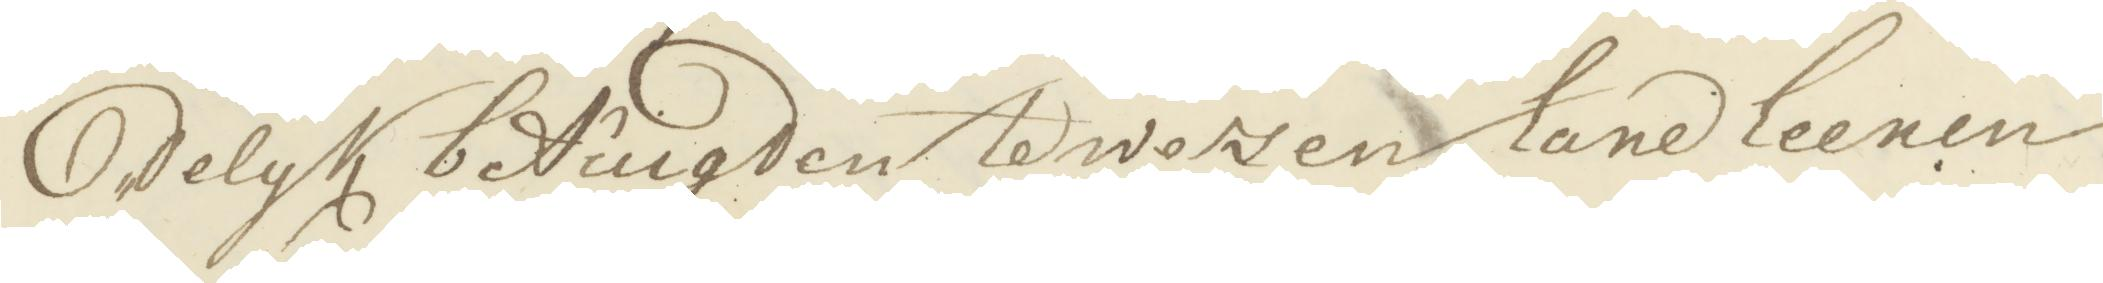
delijk betuigden te wesen hare heeren
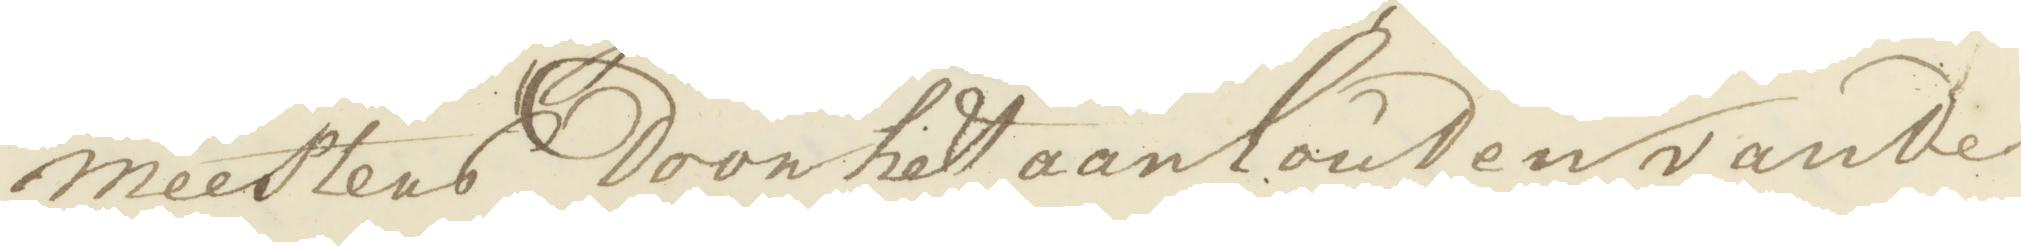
meesters door het aanhouden van de
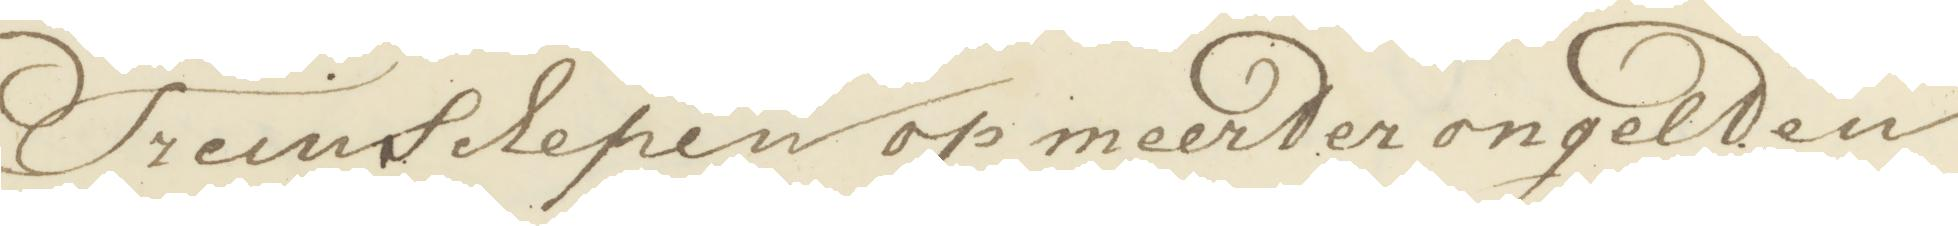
Treinschepen op meerder ongelden
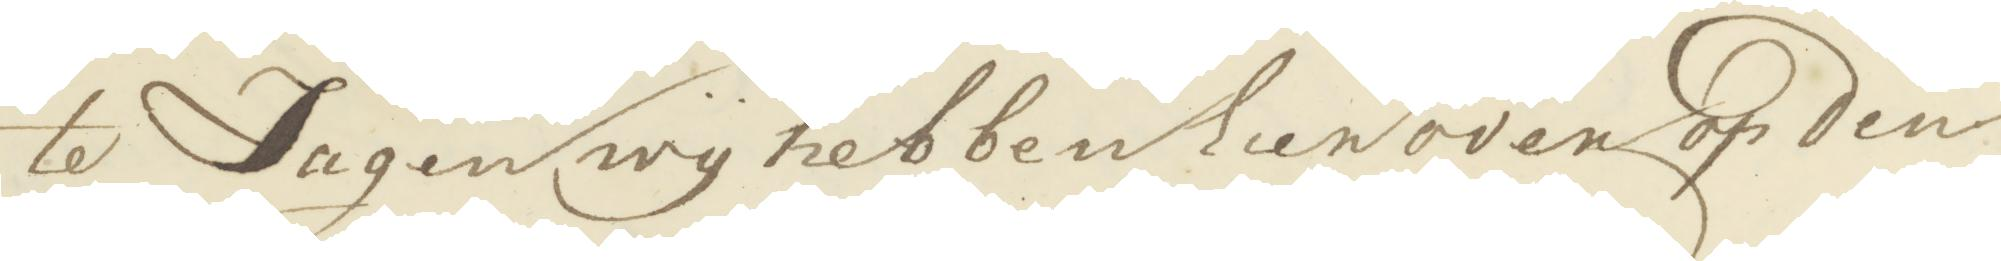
te Iagen wij hebben hier over op den
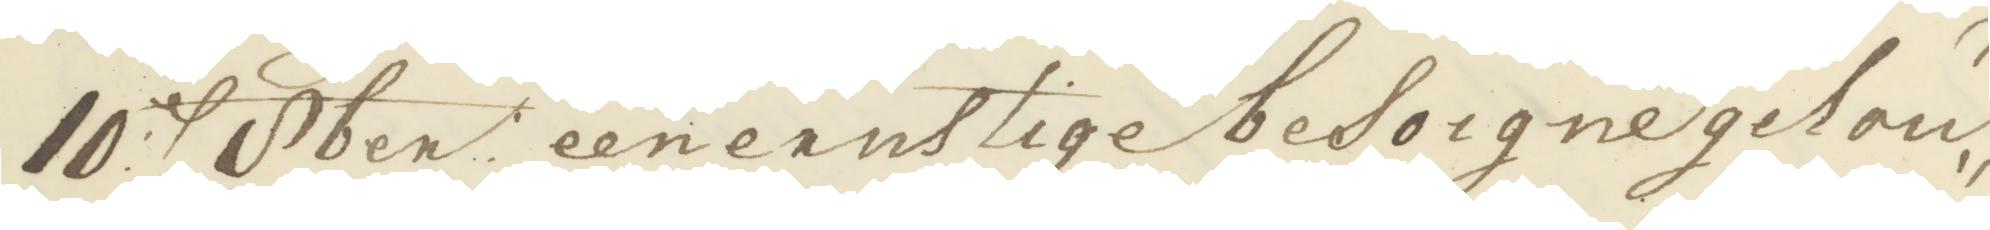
10:e 8ber: een ernstige besoigne gehou„
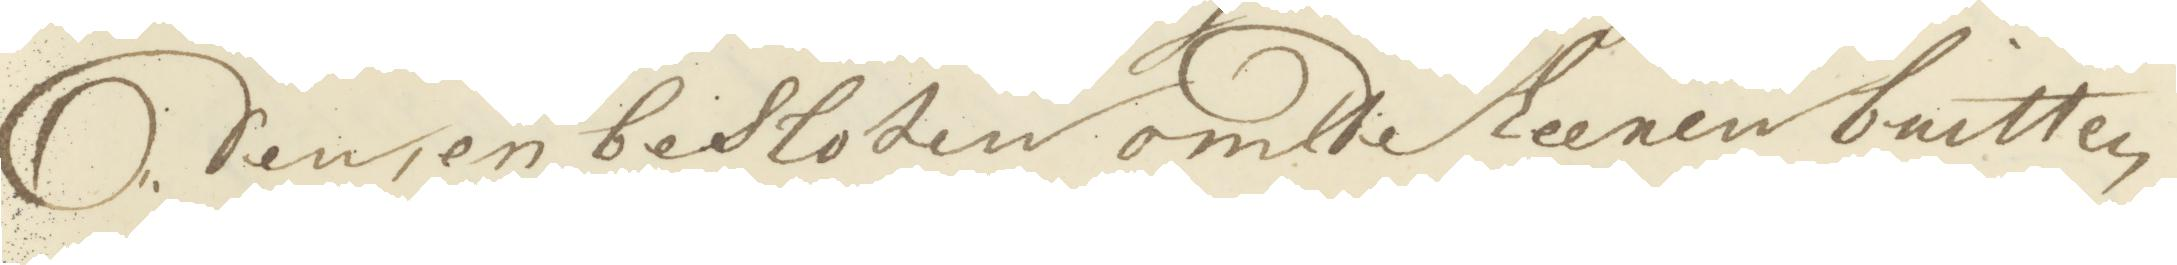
den, en besloten om de heeren buitten
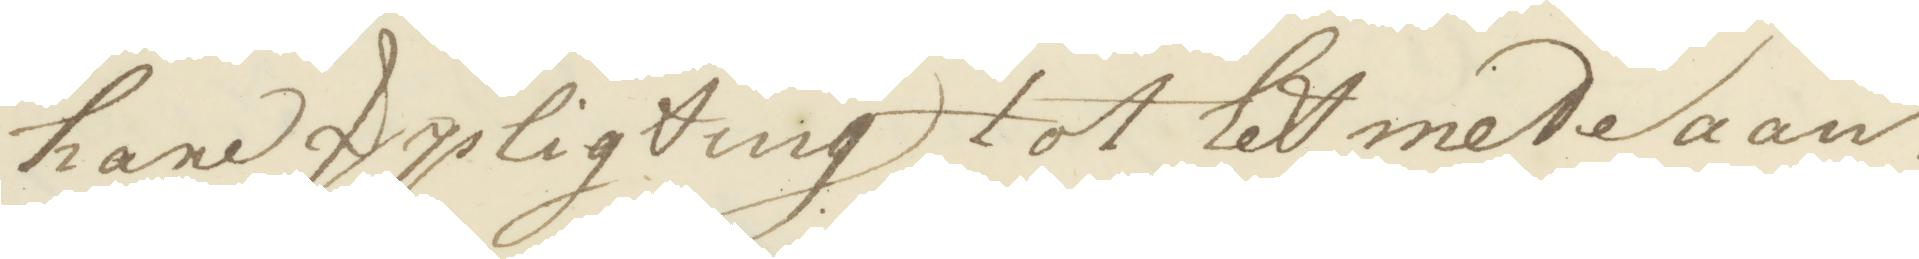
hare verpligting tot het mede aan
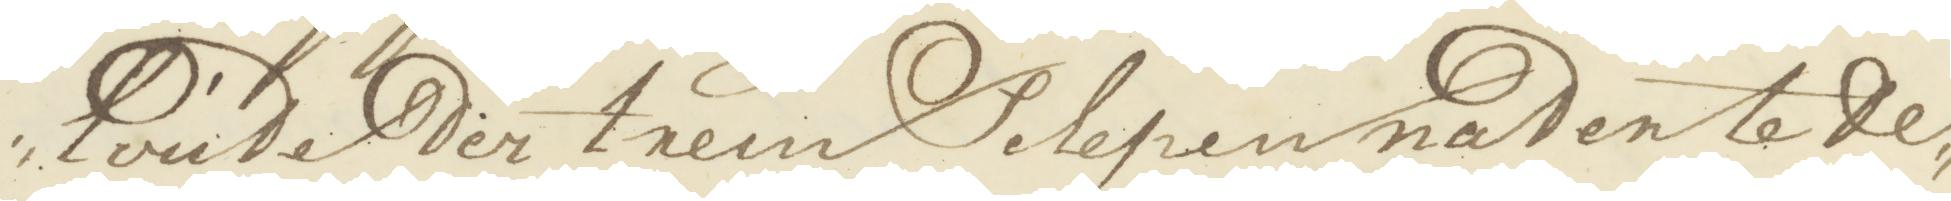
„houde der trein Schepen nader te de
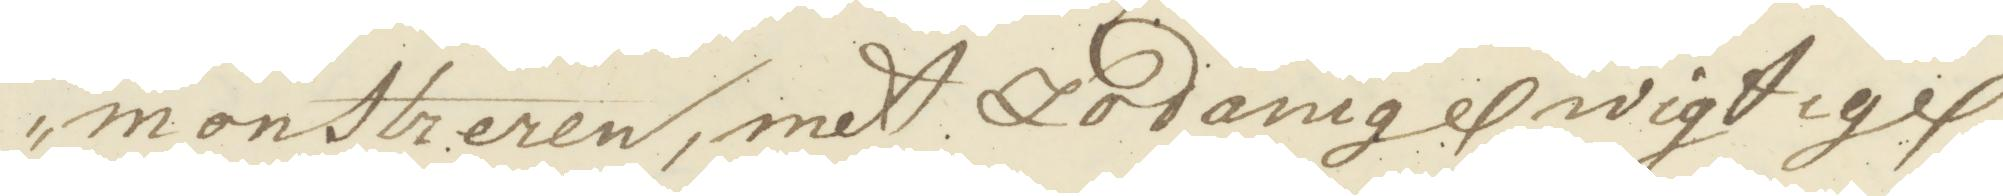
„monstreren, met zodanige wigtige
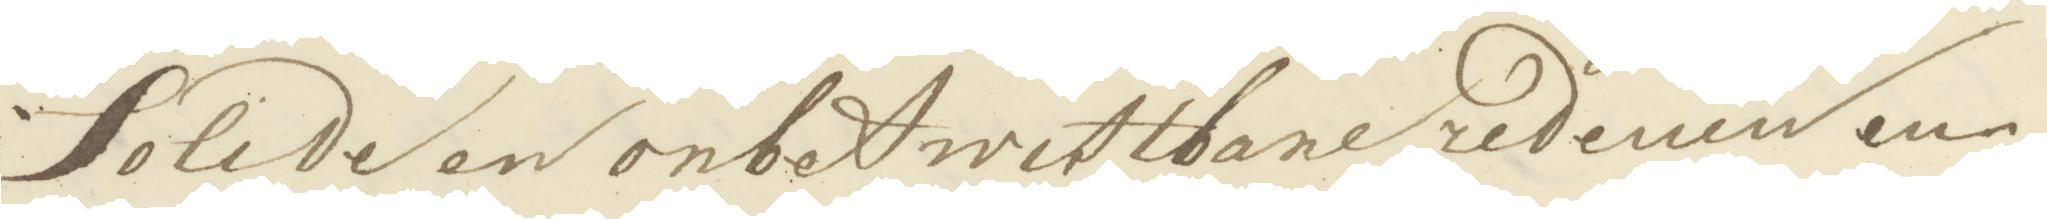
Solide en onbetwistbare redenen en
